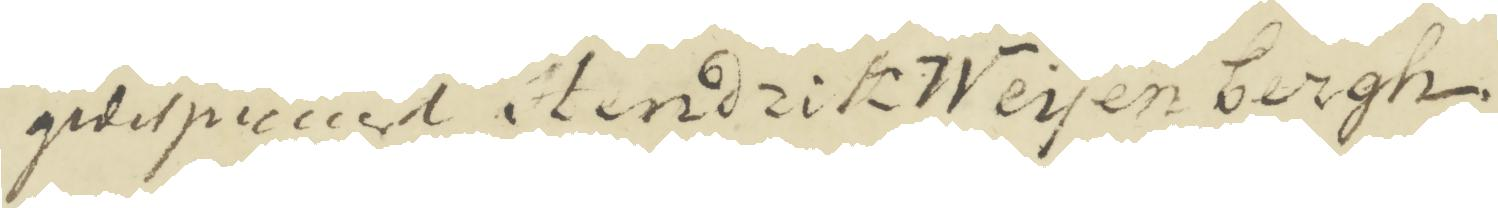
gedispicieerd, Hendrik Weijenbergh,
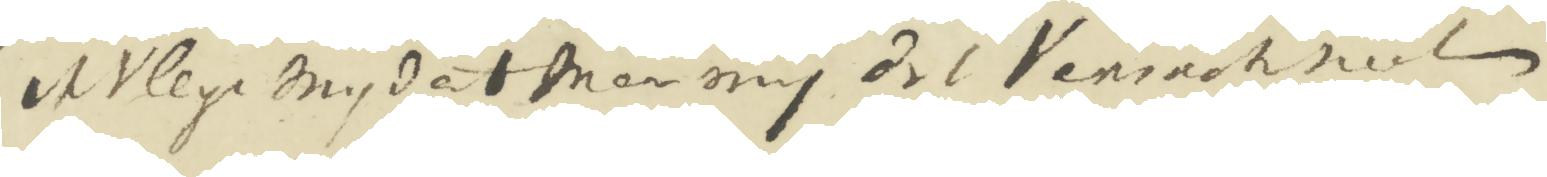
ik Vleye mij dat men mij dit Versoek niet
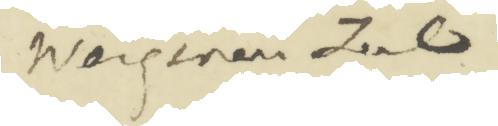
weigeren zal
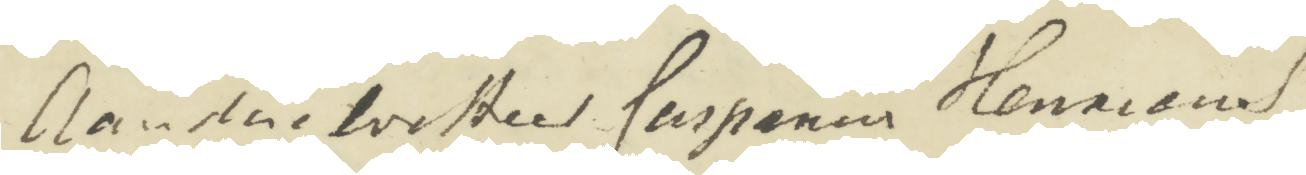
Aan dese tot Heer Casparus Henricus
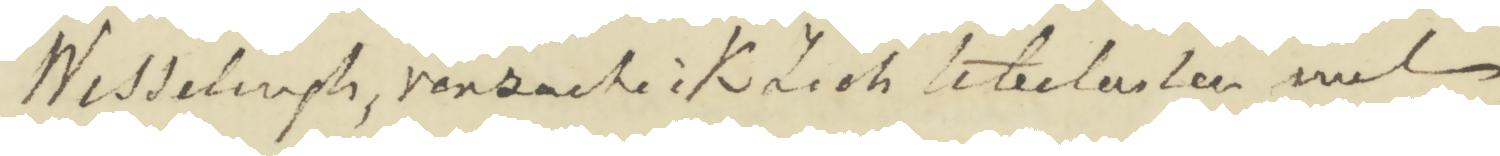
Wesselingh, verzoeke ik zich tebelasten met
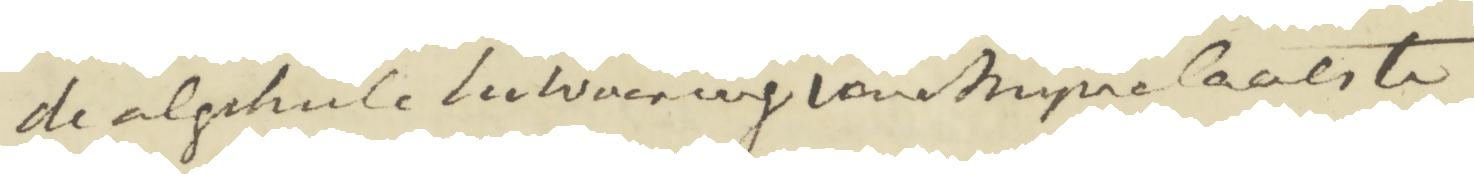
de algeheele Uitvoering van Myne laatste
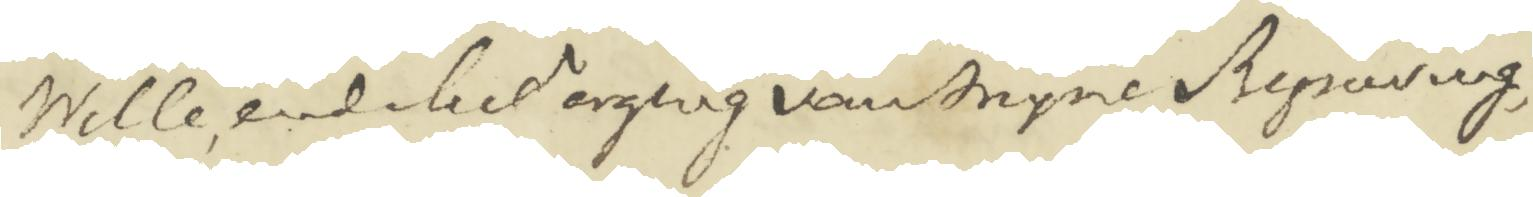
Wille, ende het argting van Mijne Regteweeg,
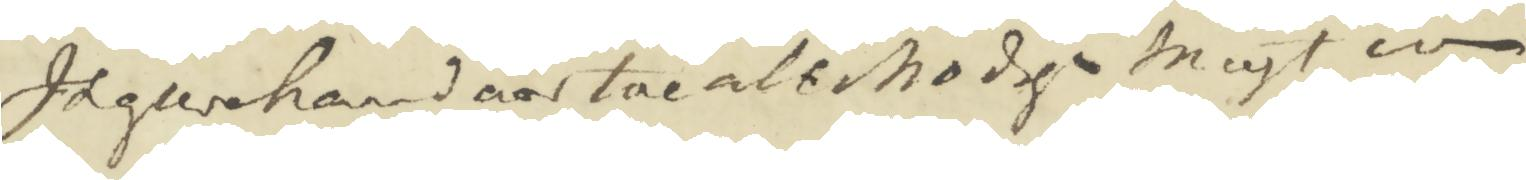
Agushan daartoe als Nodige meijt, en
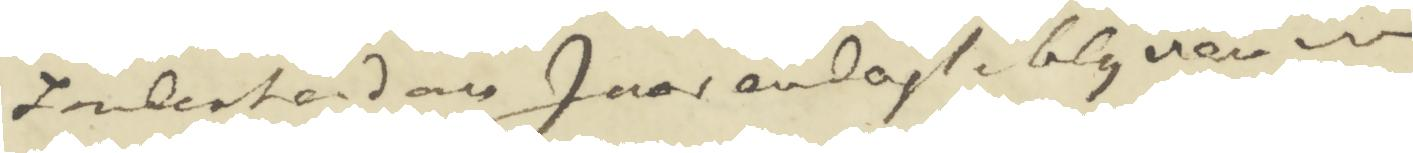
Inbesten doen Jaar en dagte blijven in
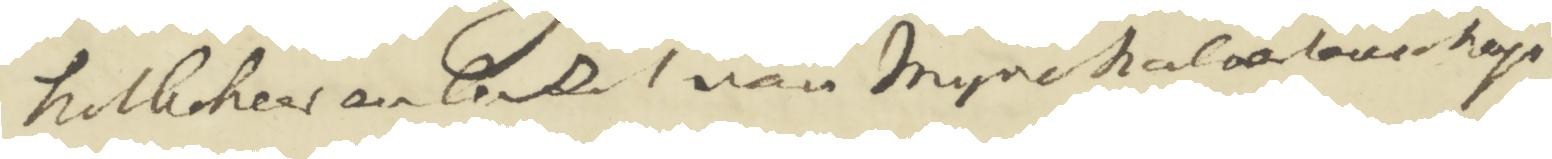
Het beheer en last van Mijne Nalaatenschap
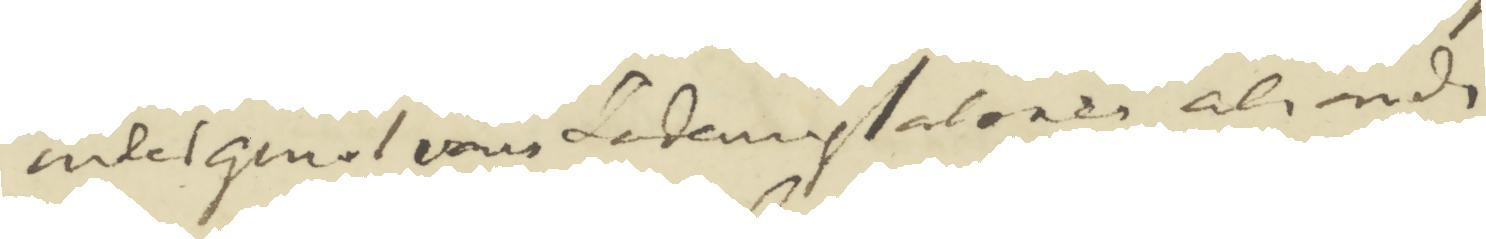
enhet genot van sdenrijtabores, als med
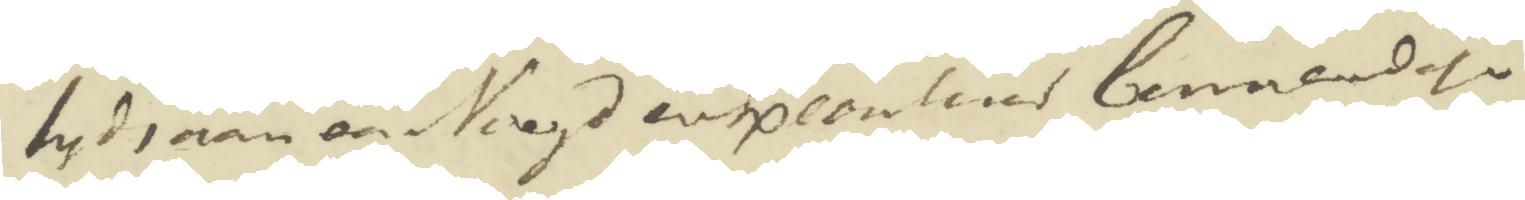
tijd, aan een Voogd en enplontens binnen dese
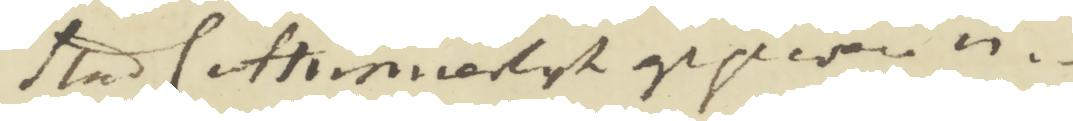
stad Costumelijk gegeeven is.
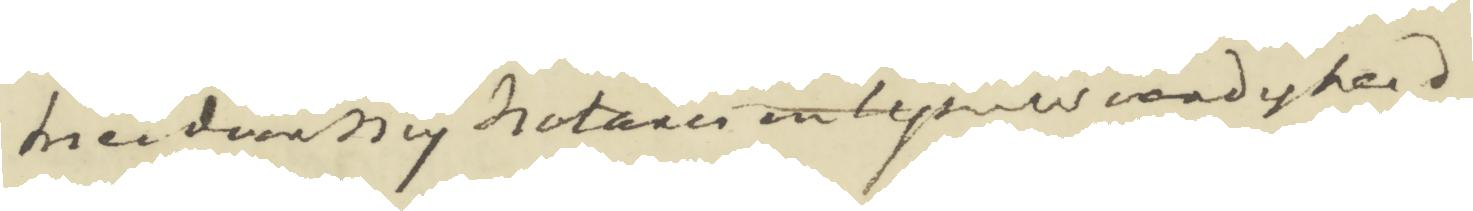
trice door my Notaris in tegenwoordigheid
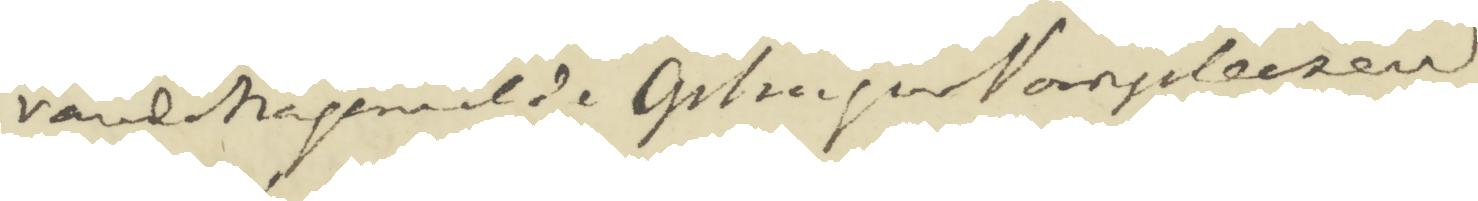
vande Nagemelde Getuigen Voorgeleezen
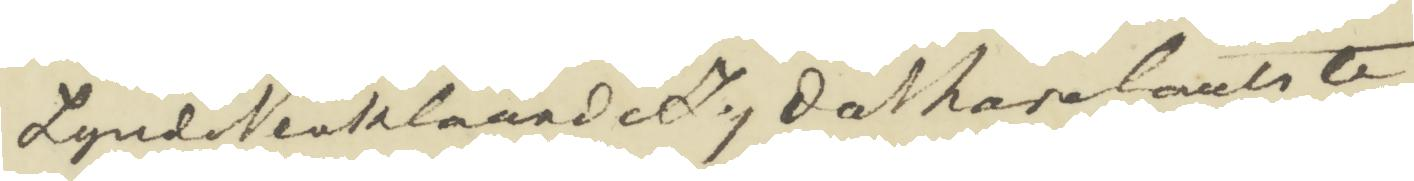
Zijnde, Verklaarde Zij dat hare laatste
